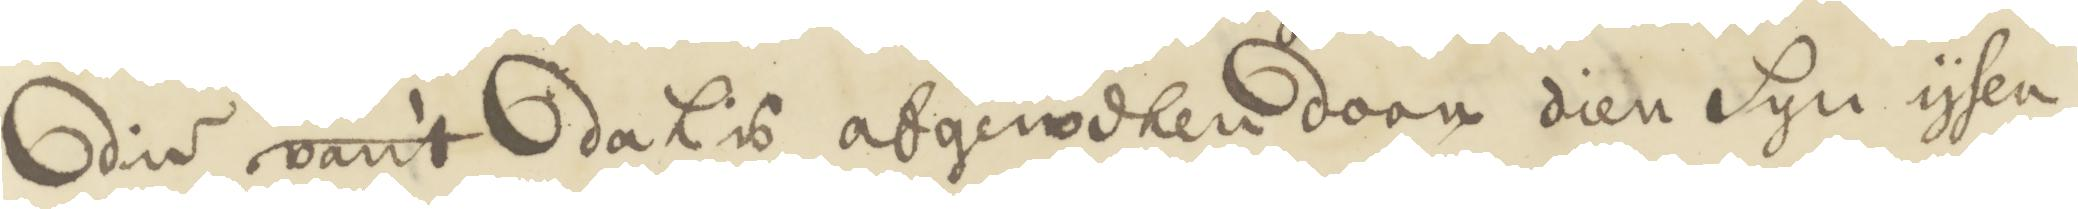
die van’t dak is afgeweken door dien Syn ijser
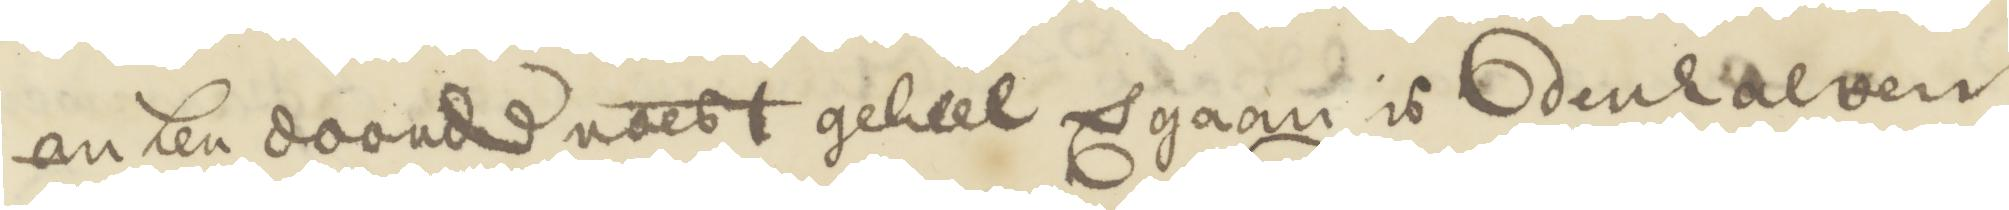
anker door de roest geheel vergaan is derhalven
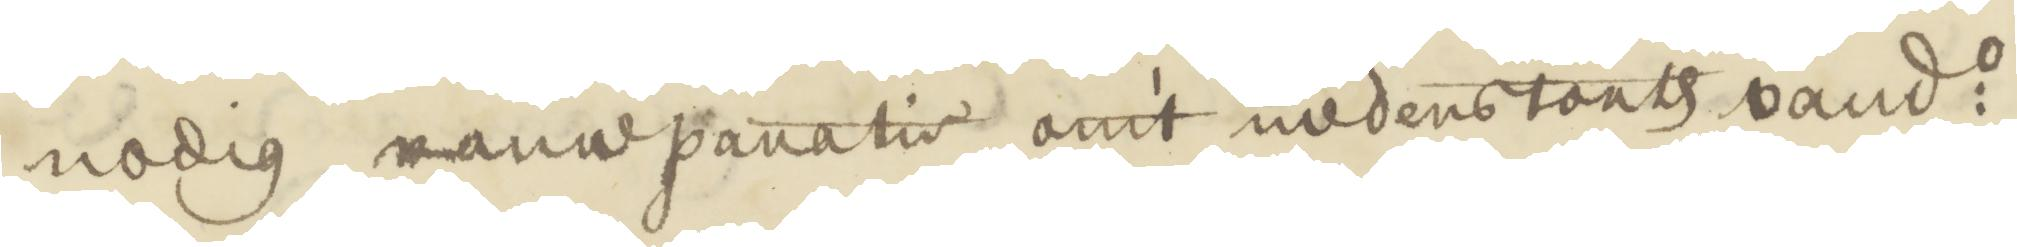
nodig van reparatie om't nederstorten van d:o
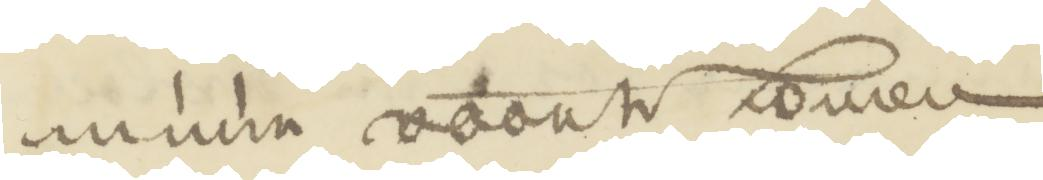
muur voor te komen
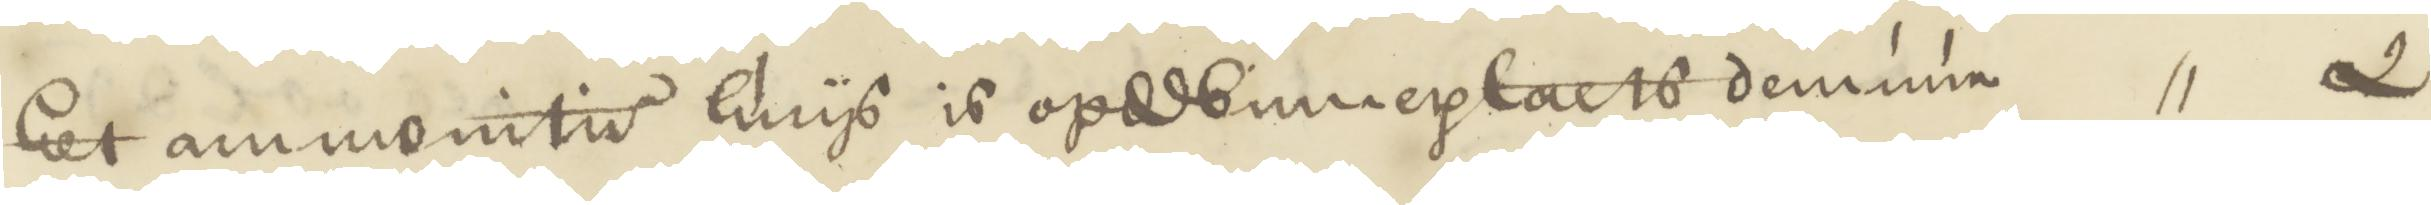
het ammonitie huijs is op de binneplaets de muur „ 2
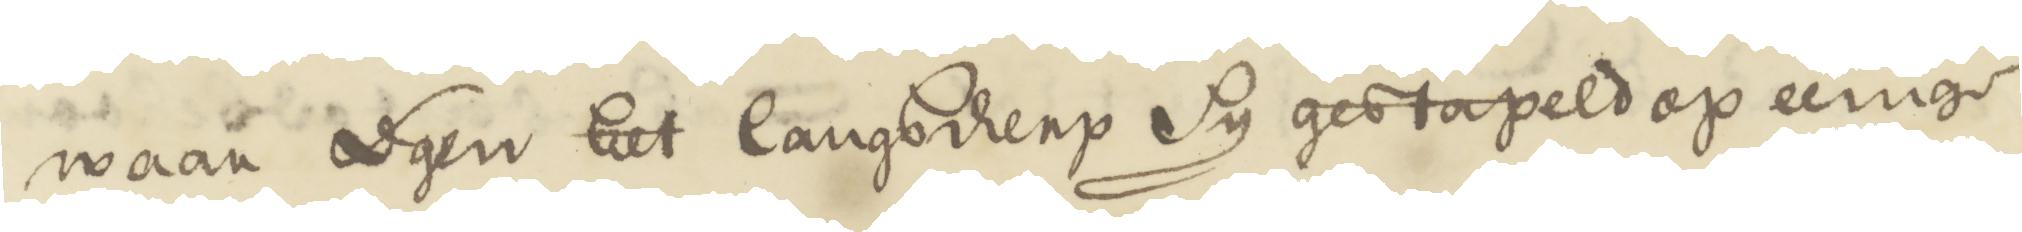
waar tegen het langscherp Sy gestapeld op eenige
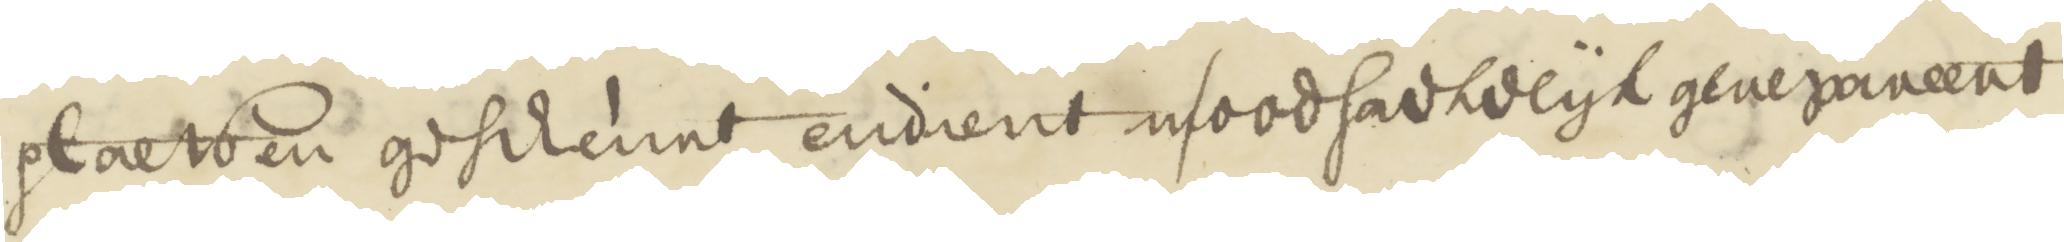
plaetsen gescheurt en dient nnoodsaekelijk gerepareert
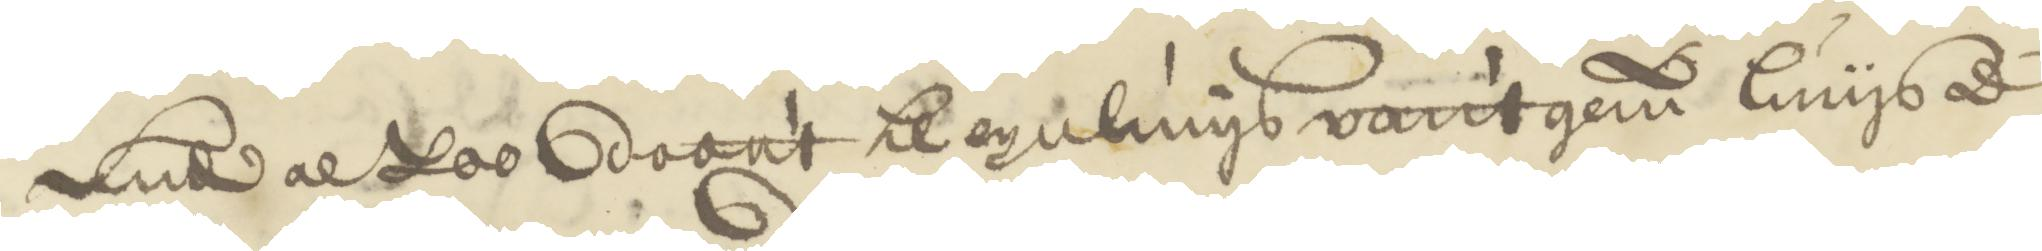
Ende alzoo door't kleynhuijs van ’t gem: huijs te
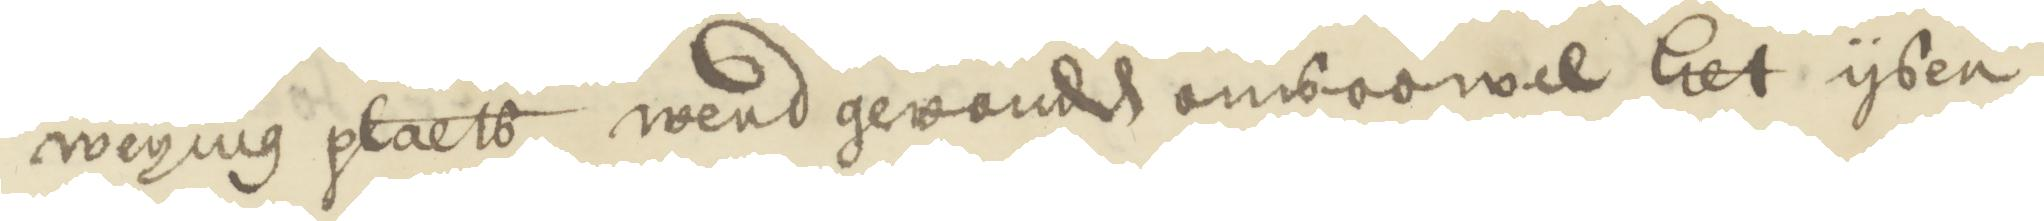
weijnig plaets werd gevonden om soowel het ijser
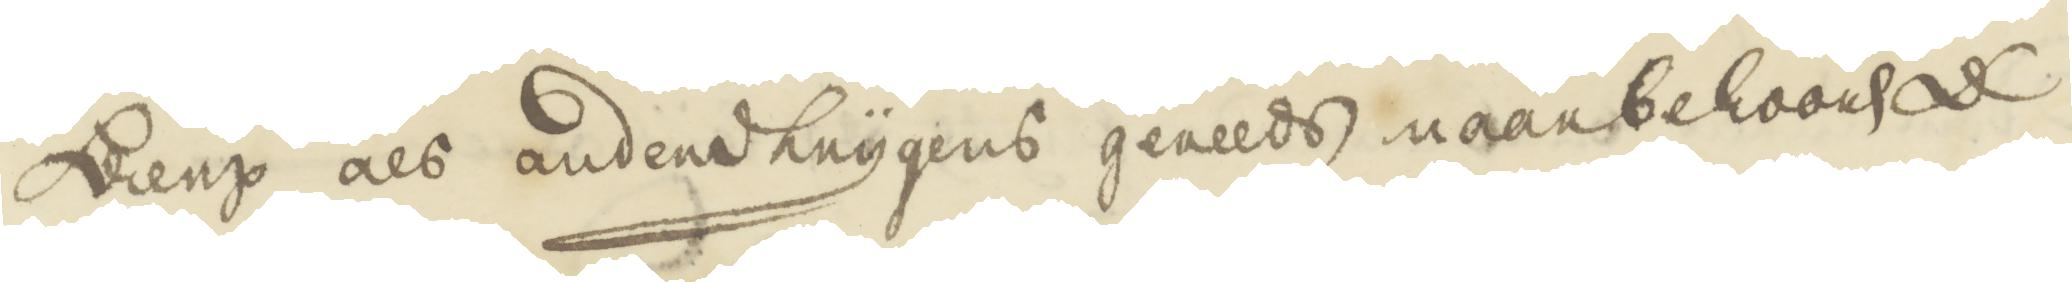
scherp als andere krijgers gereeds naar behooren te
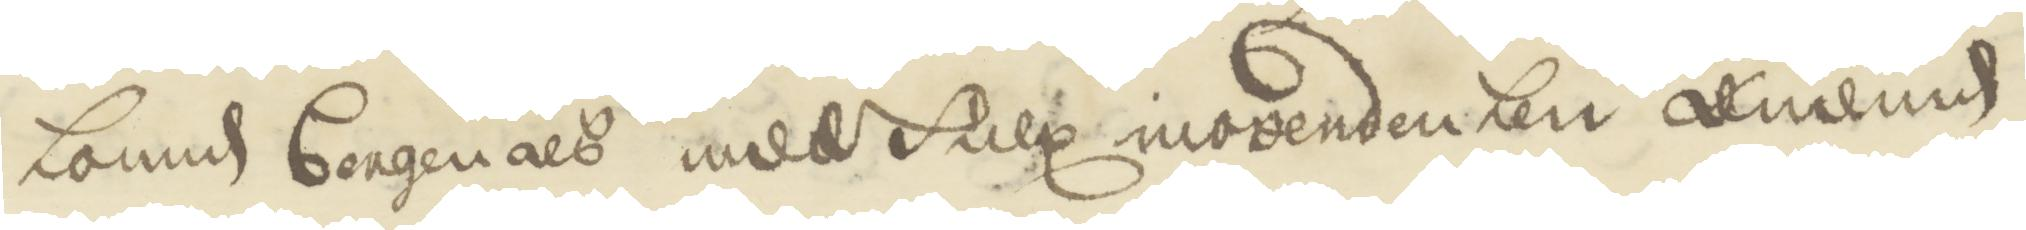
konnen bergen als mede Sulx in overdenken tenemen
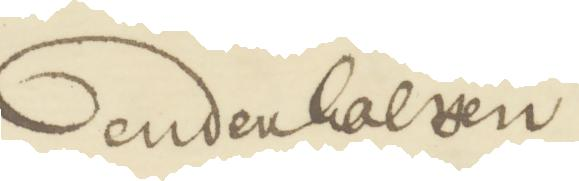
en derhalven
